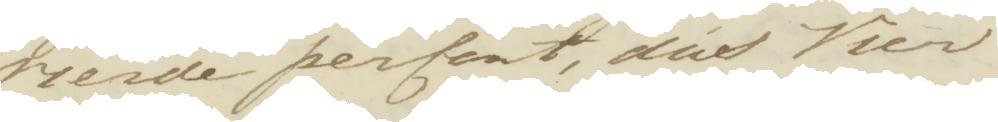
vierde percent, dus Vier
